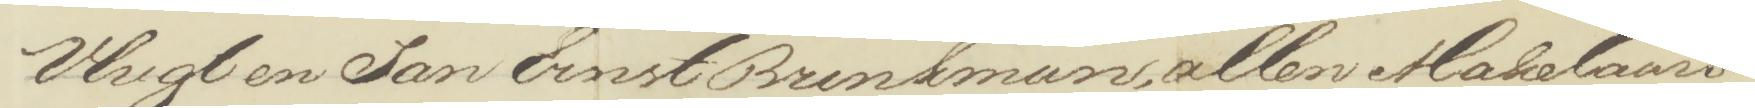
Vlugt en Ian Ernst Brinkman, allen Makelaars
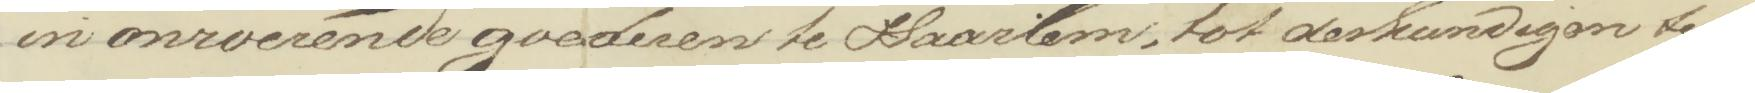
in onroerende goederen te Haarlem, tot deskundigen ter
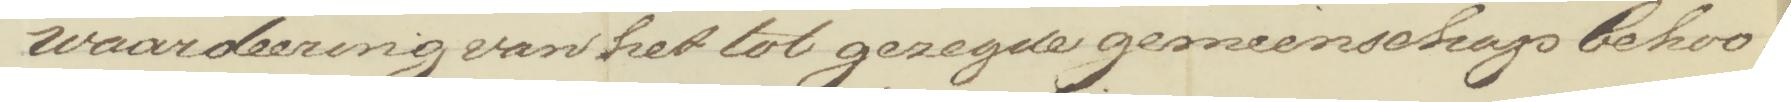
waardeering van het tot gezegde gemeenschap behoo.
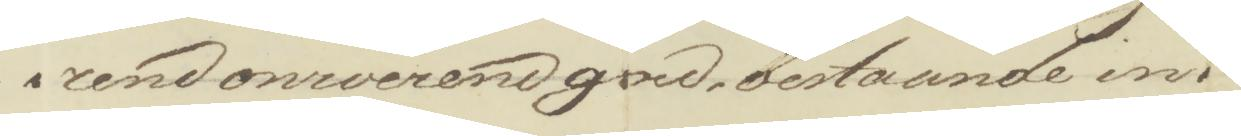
„rend onroerend goed, bestaande in.
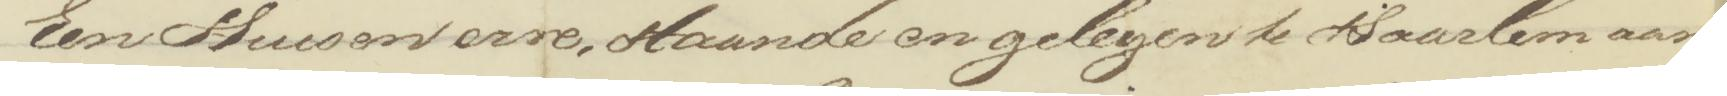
Een Huis en erve, staande en gelegen te Haarlem aan
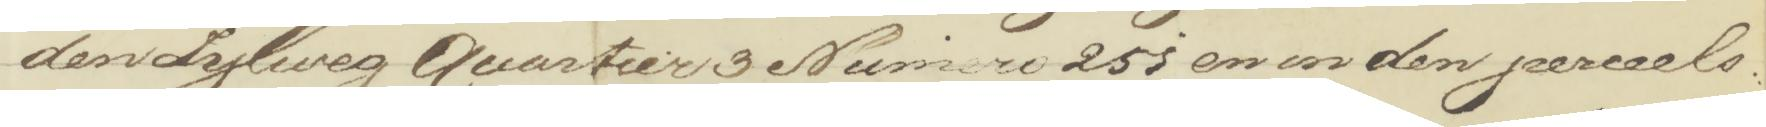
den Zylweg Quartier 3 Numero 251 en in den perceels.
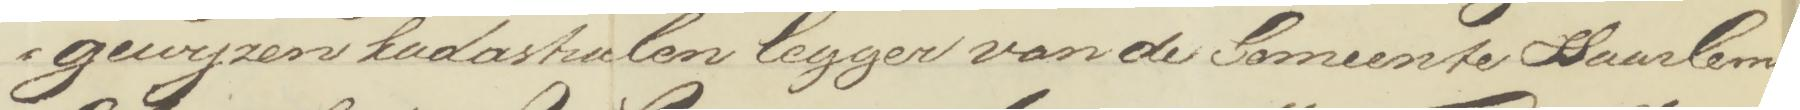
„gewyzen kadastralen legger van de Gemeente Haarlem
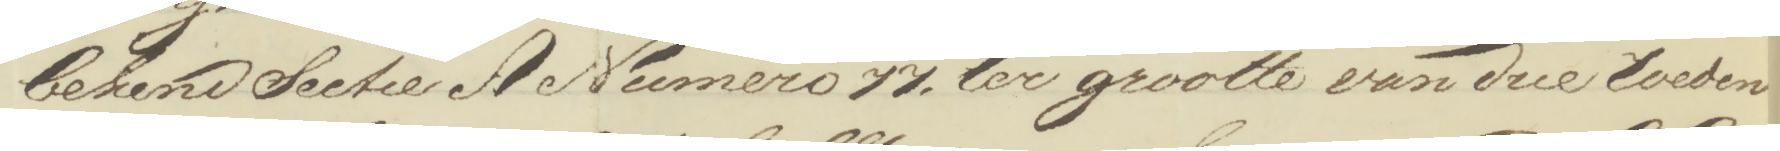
bekend Sectie A Numero 77. ter grootte van drie roeden
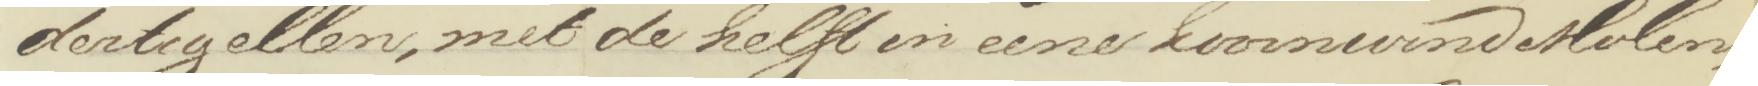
dertig ellen, met de helft en eene koornwind Molen,
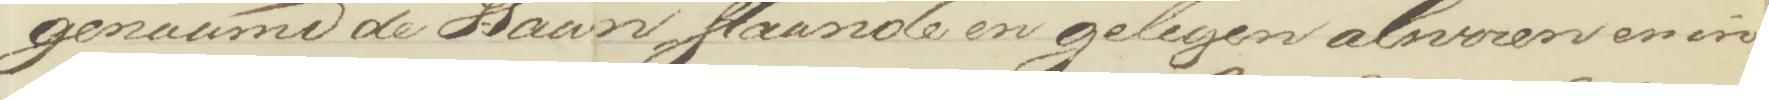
genaamd de Haan, staande en gelegen alsvoren en in
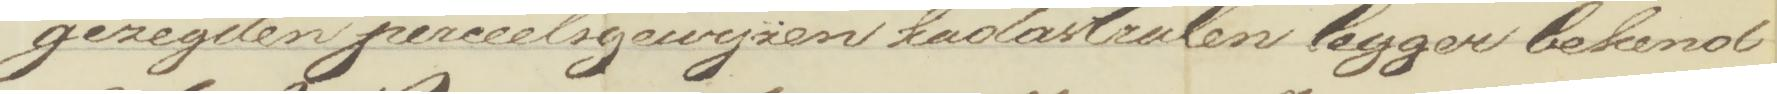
gezegden perceels gewijzen kadastralen legger bekend
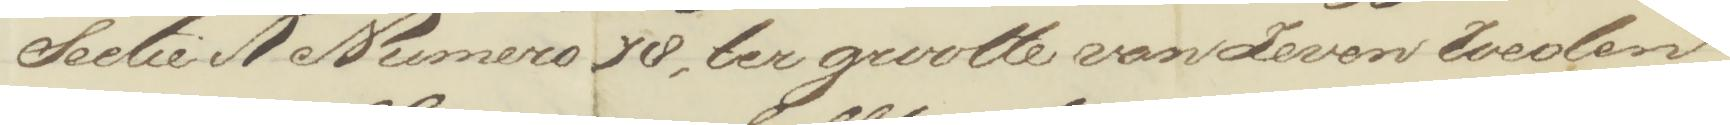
sectie A Numero 78, ter grootte van Zeven roeden
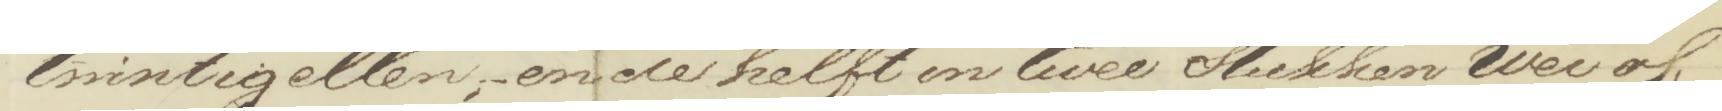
twintig ellen, en de helft in twee stukken wei of
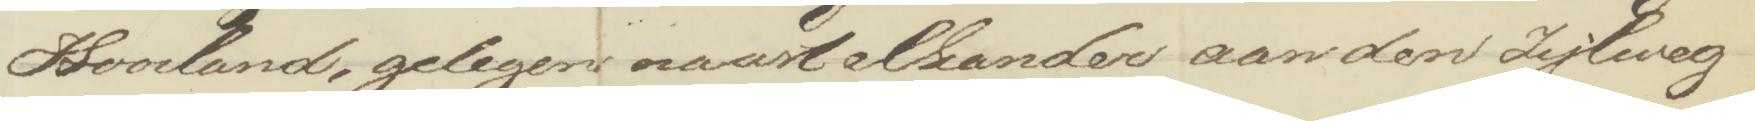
Hooiland, gelegen naast elkander aan den Zijlweg
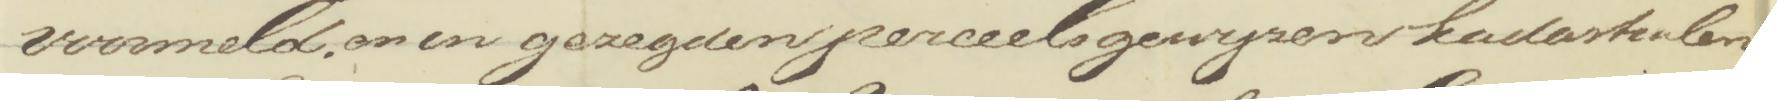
voormeld, en in gezegden perceels gewyzen kadastralen
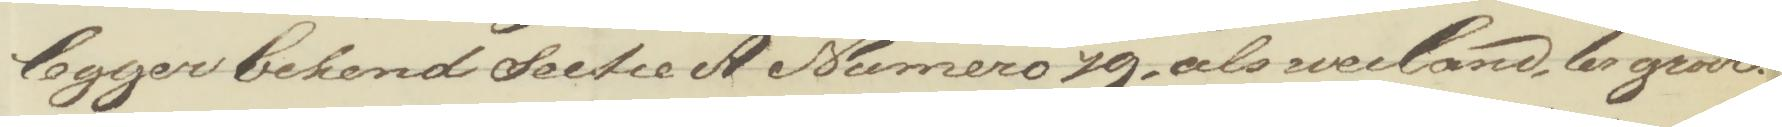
legger bekend sectie A Numero 79, als weiland, ter groot.
